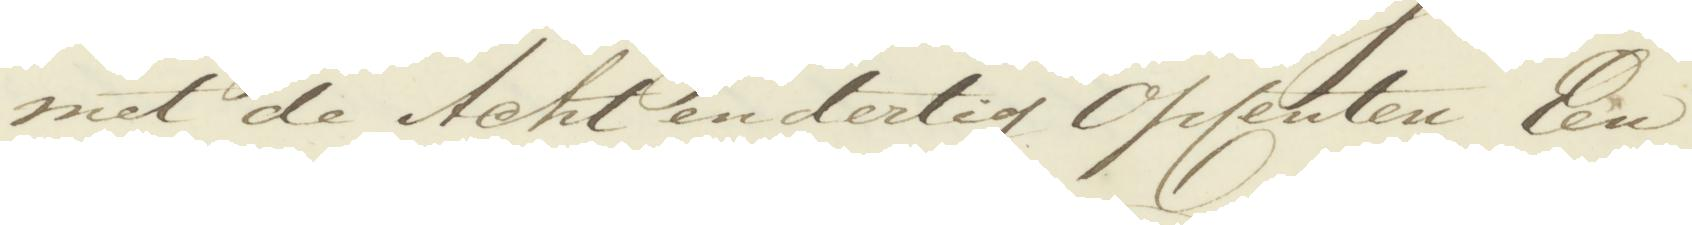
met de Acht en dertig Opcenten Een
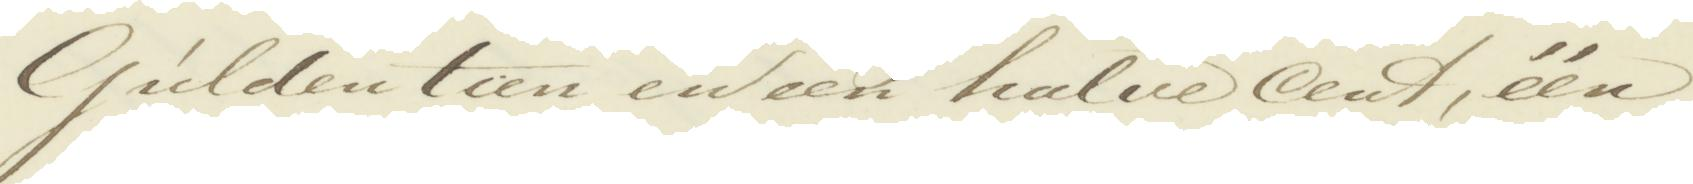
Gulden tien en een halve cent, één
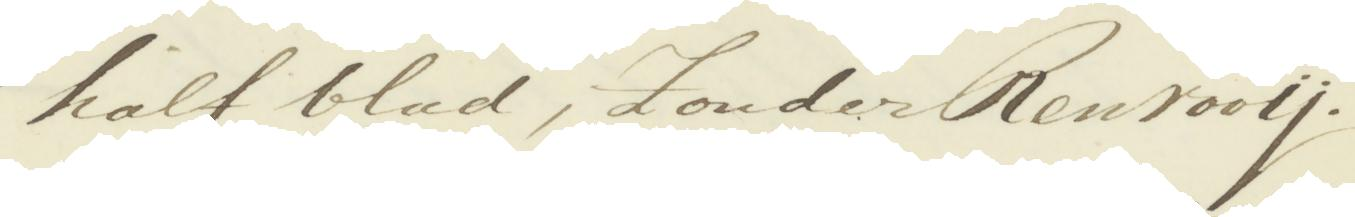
half blad, Zonder Renvooij.
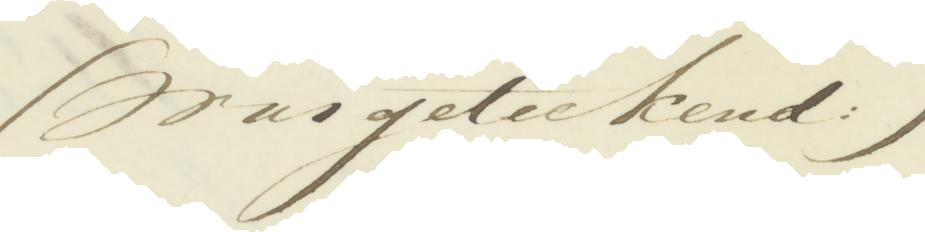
(Was geteekend:)
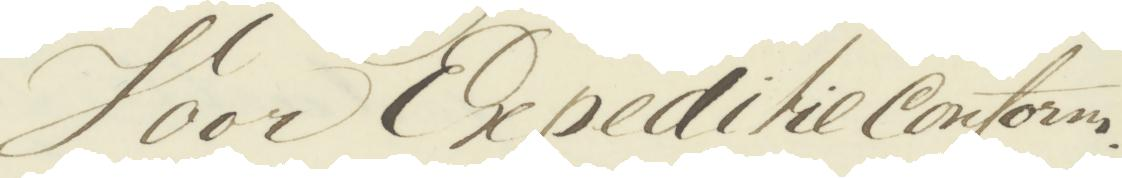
Voor Expeditie Conform
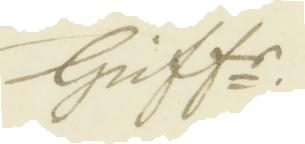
Griff=.r
